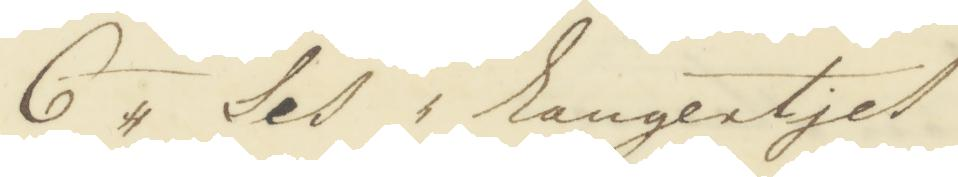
6„ ses „ hangertjes
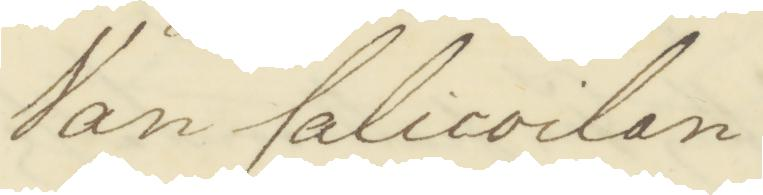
Van Calicoilan
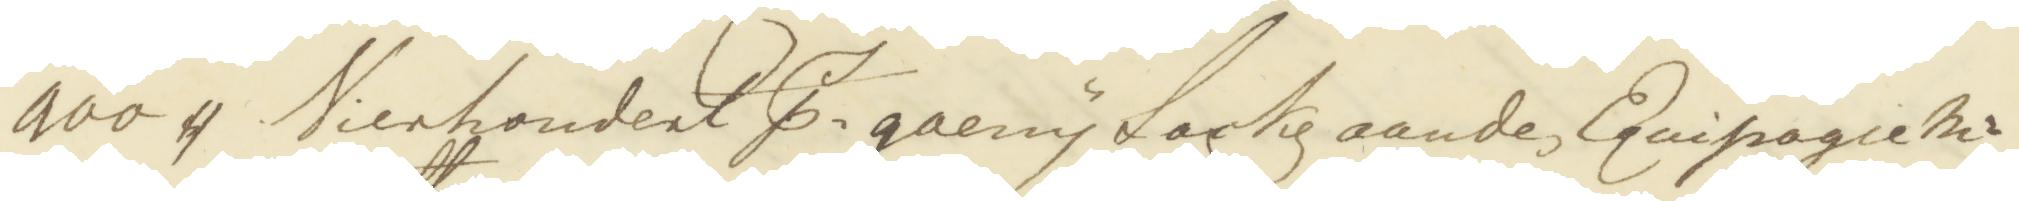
400 „ Vierhondert p„s goenij sacken aan den Equipagie m„r
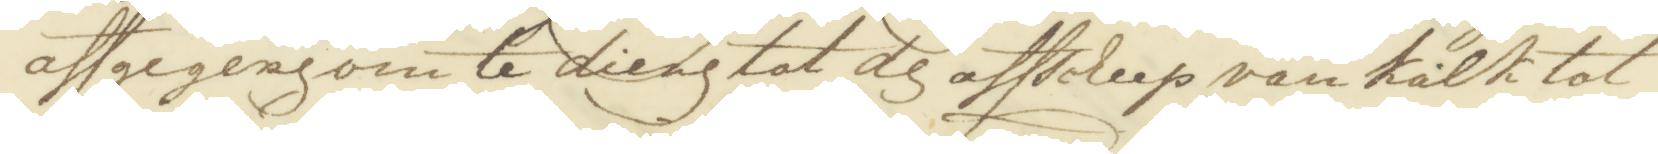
affgegene om te dienen tot den affscheep van kalk tot
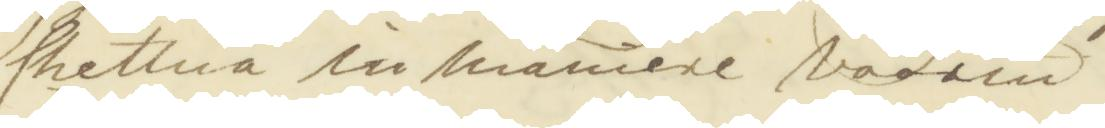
Chettua in maniere vooren
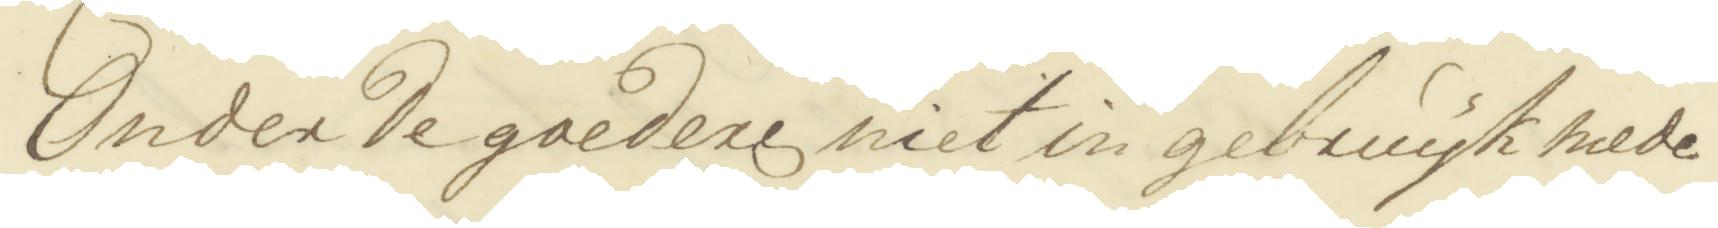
Onder de goederen niet in gebruijk mede
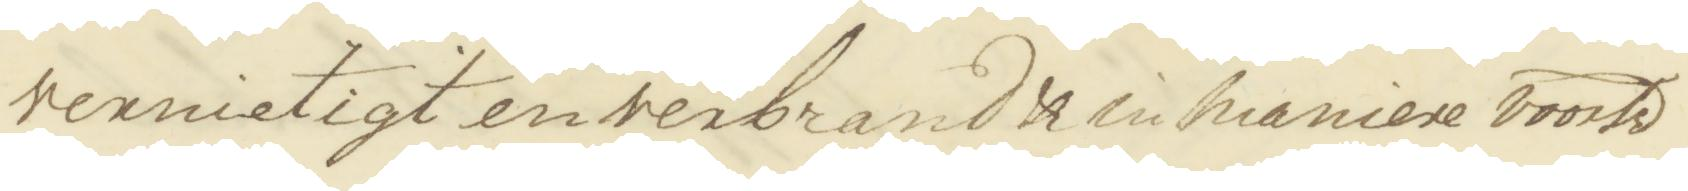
vernietigt en verbrand & in maniere voorts
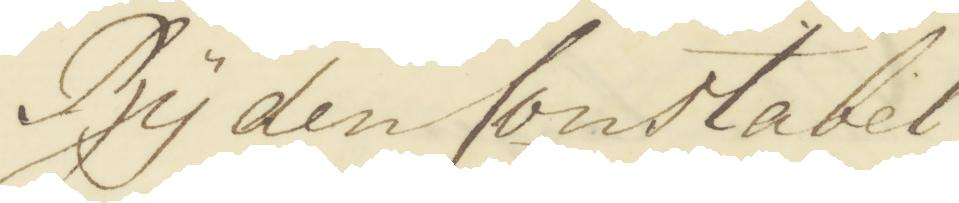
Bij den Constabel
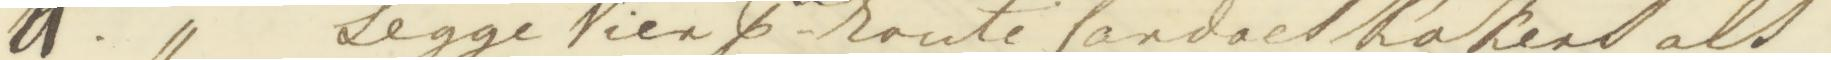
4. „ segge vier p-s houte Cardoes kokers als
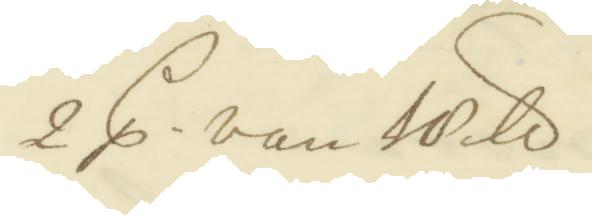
2 p-s van 18 lb
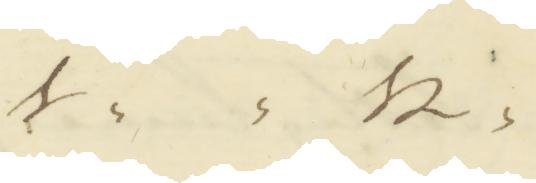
1 „ „ 12„
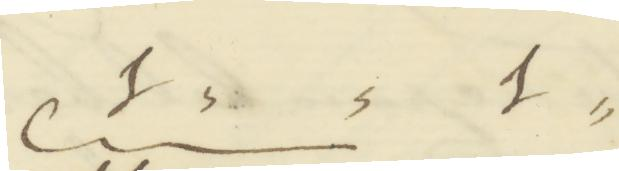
1 „ „ 1 „
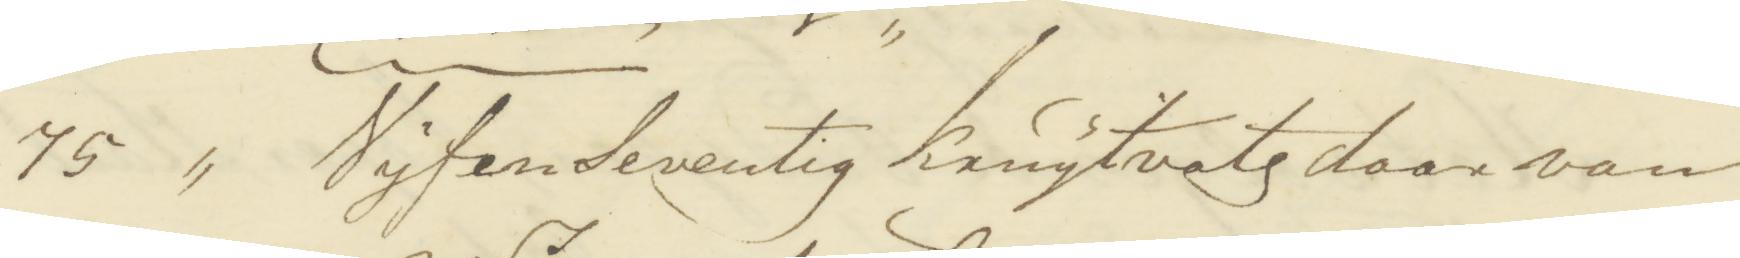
75 „ Vijfenseventig kruijtvaten daar van
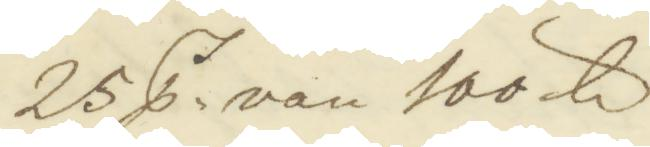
25 p„s van 100 lb
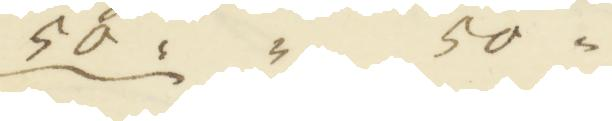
50 „ „ 50 „
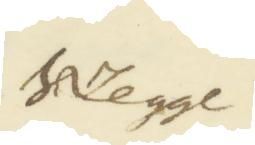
1 Zegge
